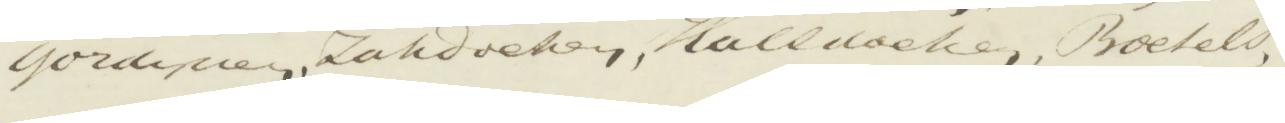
gordynen, zakdoeken, Halsdoeken, Boetels,
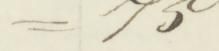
= 75
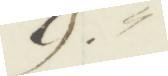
9. „
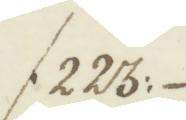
ƒ223:—
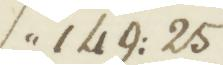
„ 149:25
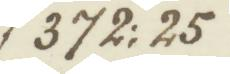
ƒ„372:25
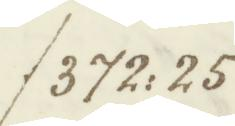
ƒ372:25
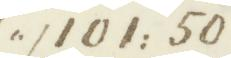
„101: 50
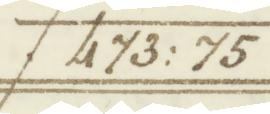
ƒ473:75
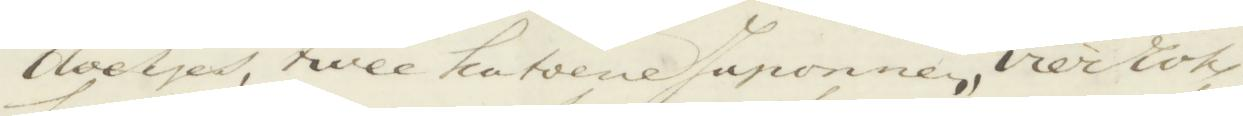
doekjes, twee katoene Japonnen, vier rok,
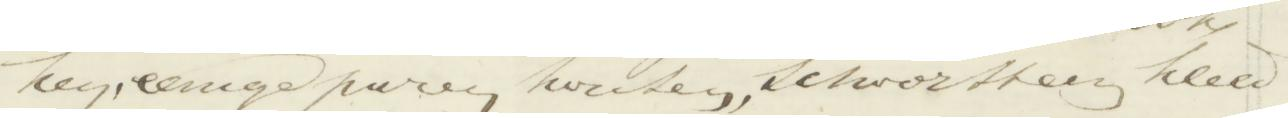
ken. eenige paren kousen, schoorsteen kleed
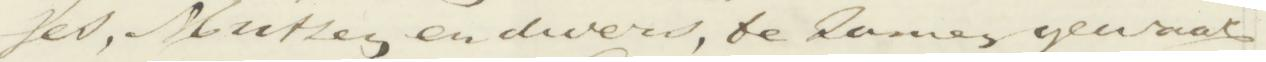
jes, Mutsen en divers, te zamen gewaar
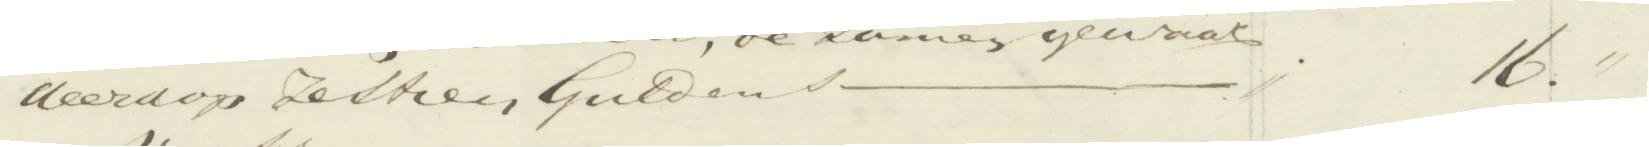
deerd op zestien Guldens— 16: „
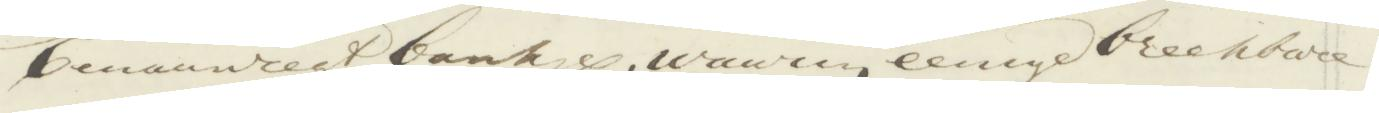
Een aanregt bankje, waarin eenige breekbare
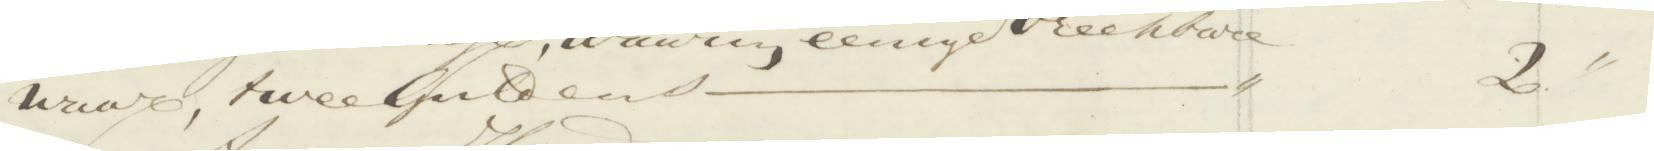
waar, twee Guldens—„ 2.„
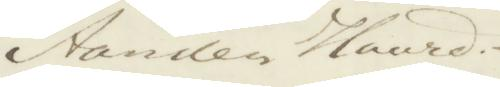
Aan den Haard.
